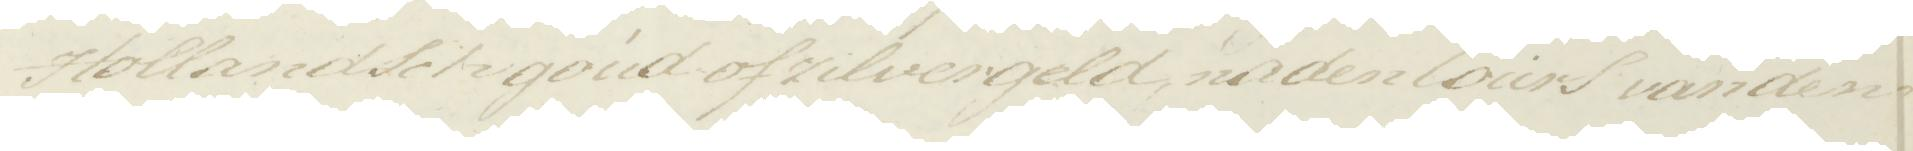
Hollandsch goud of zilvergeld, in den cours van den
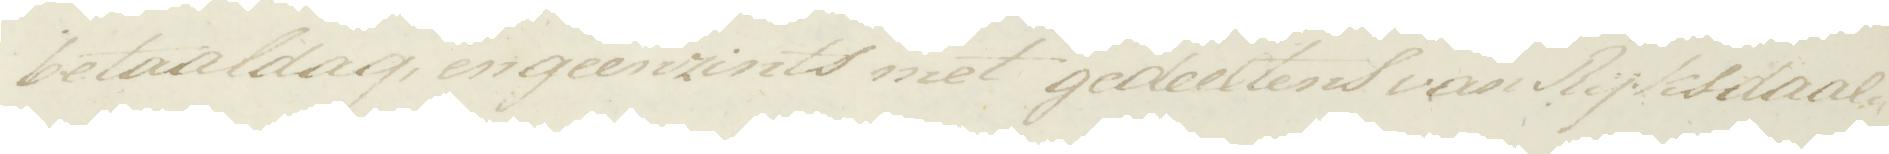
betaaldag, en geenzints met gedeeltens van Rijksdaal
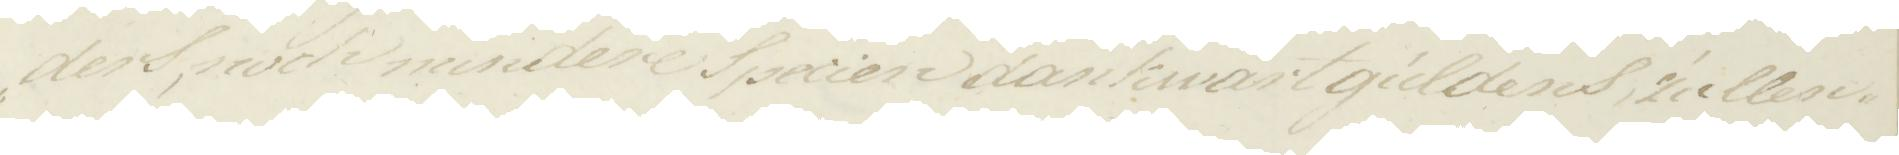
ders, noch mindere specien dan kwart guldens, zullen„
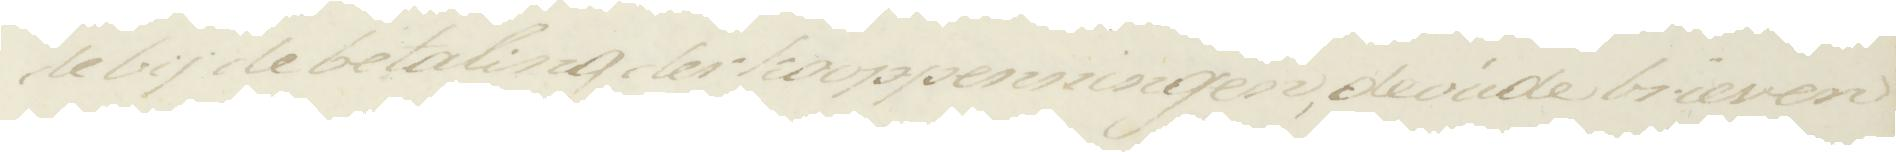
de bij de betaling der kooppenningen, de oude brieven
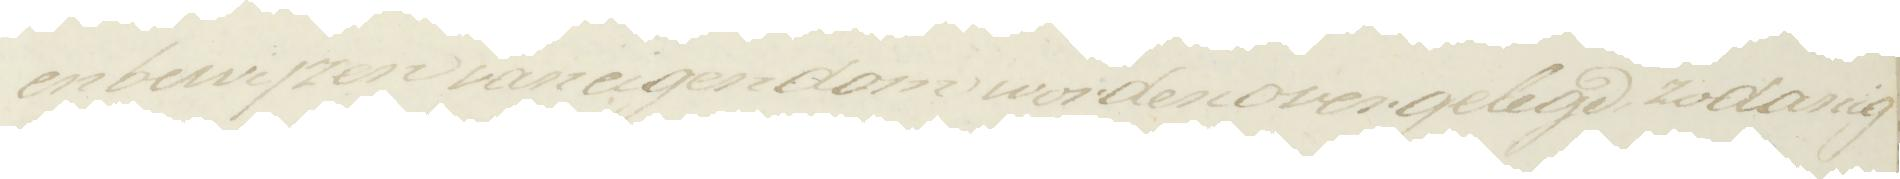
en bewijzen van eigendom worden overgelegd, zodanig
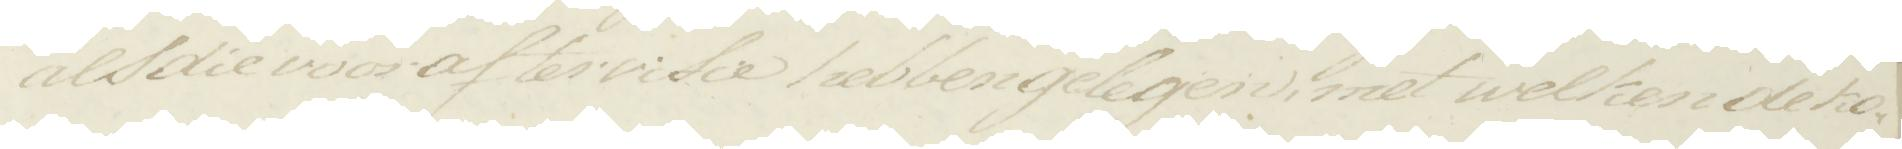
als die voor af ter visie hebben gelegen, met welken de ko„
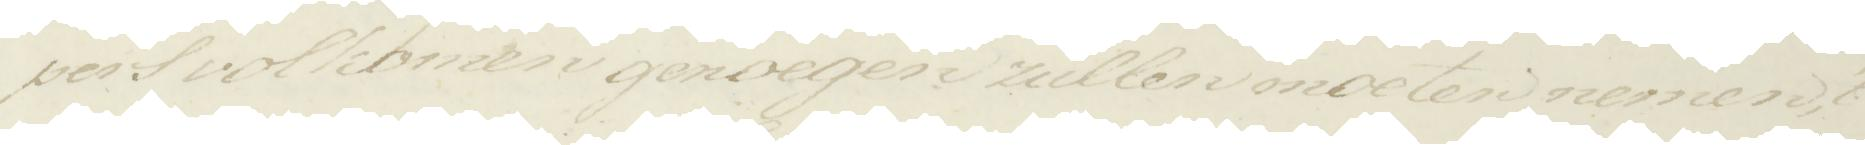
pers volkomen genoegen zullen moeten nemen, 't
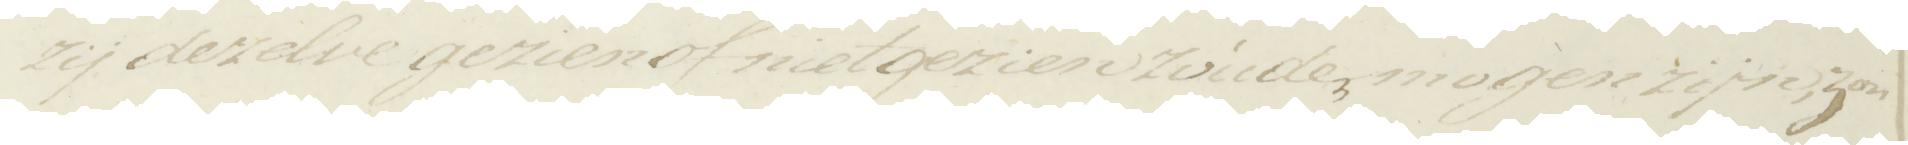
zij dezelve gezien of nietgezien zouden mogen zijn, zon
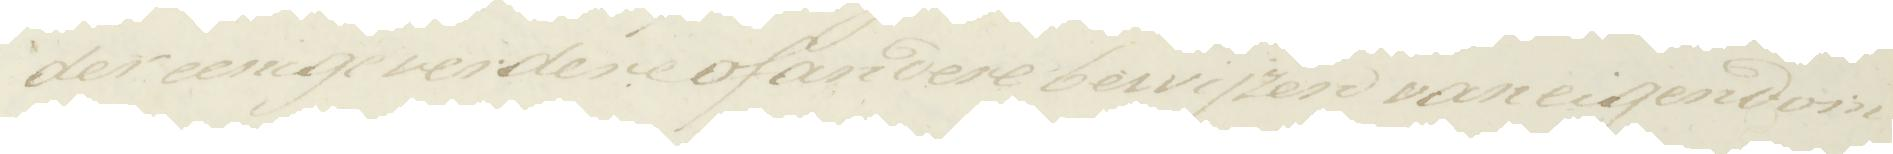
der eenige verdere of andere bewijzen van eigendom
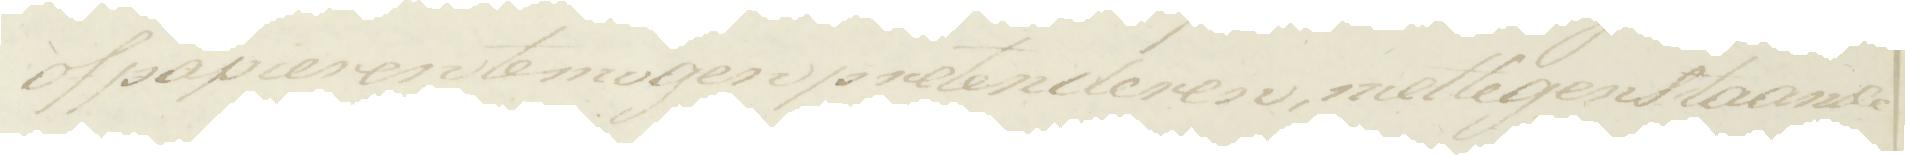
of papieren te mogen pretenderen, welegenstaande
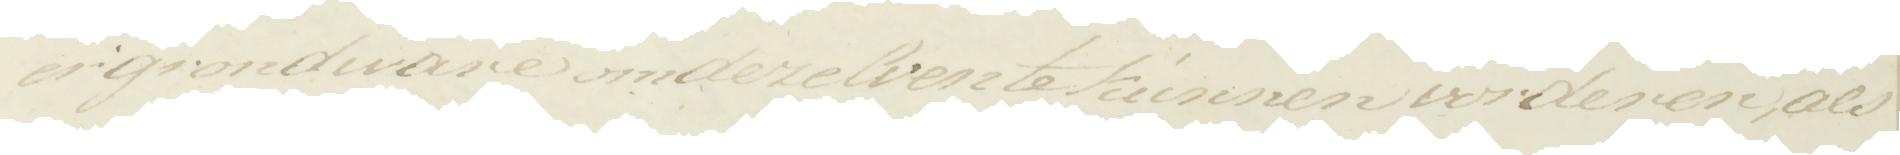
er grond ware om dezelven te kunnen vorderen, als
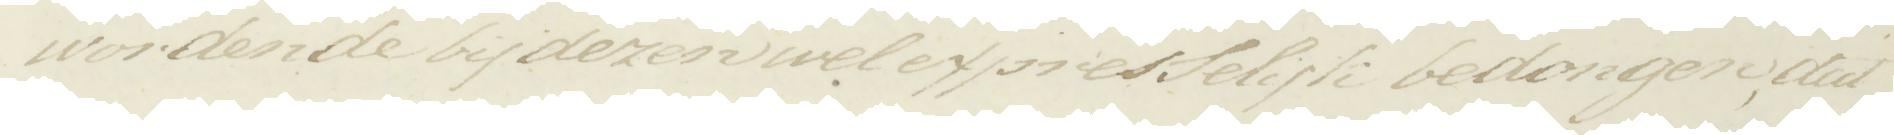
wordende bij dezen wel expresselijk bedongen, dat
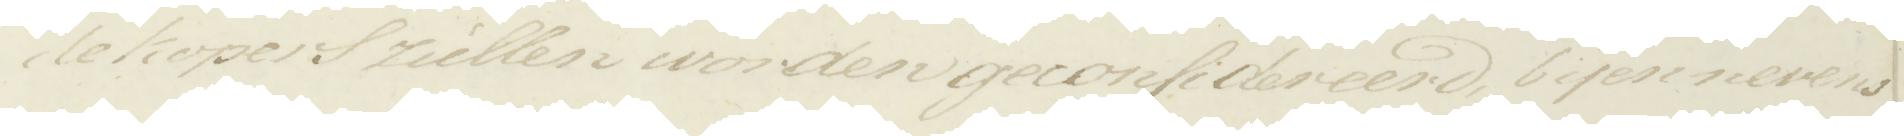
de kopers zullen worden geconsidereerd, bij en nevens
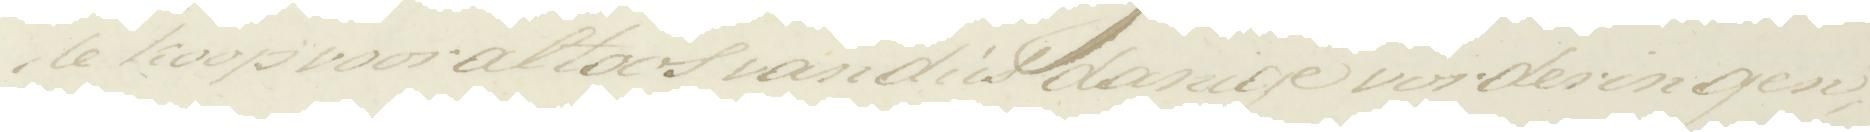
de koop voor altoos van dus danige vorderingen,
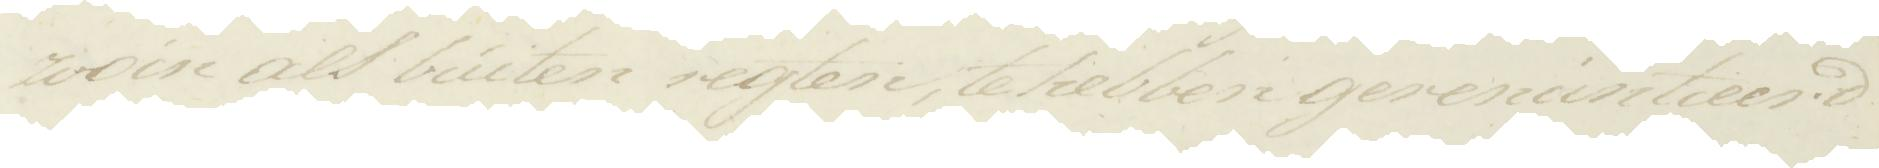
zoo in als buiten regten, te hebben gerenuntieerd.
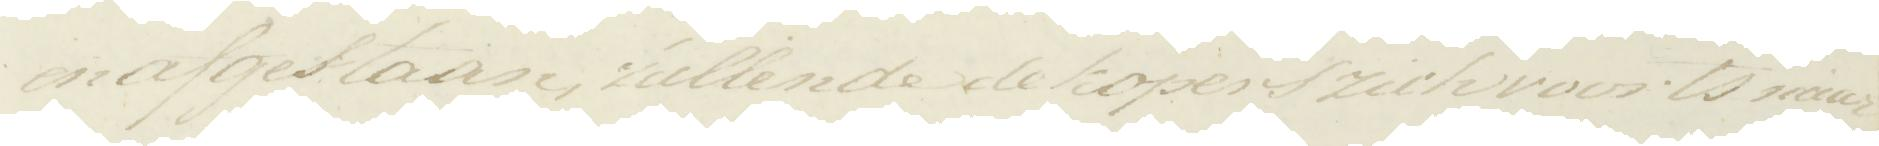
en afgestaan, zullende de kopers zich voorts naar
